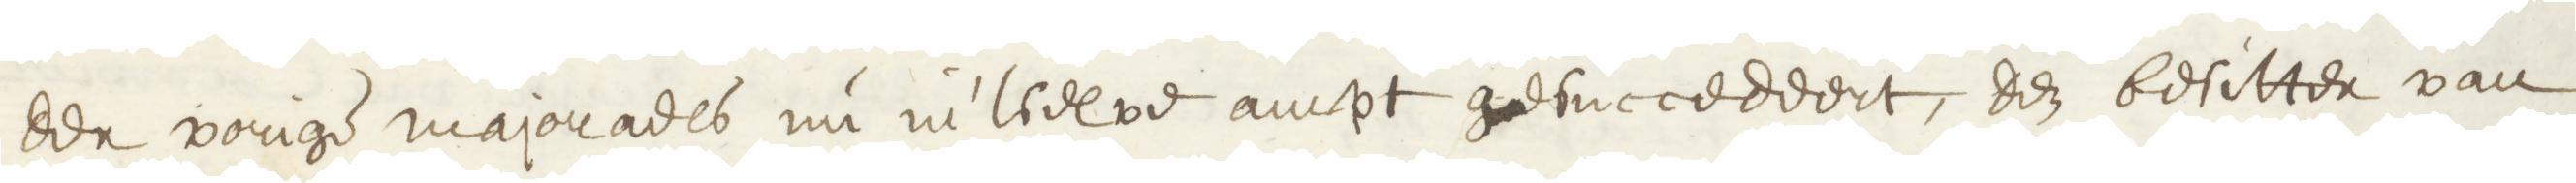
der vorige majoraels nu in 'tselve ampt gesuccedeert, den besitter van
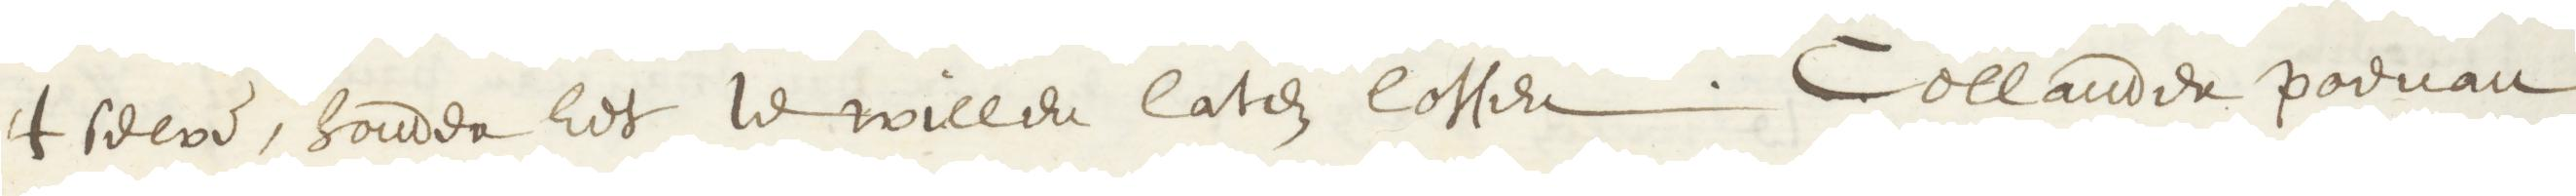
’t selve, souden het te willen laten lossen. Collander poenan
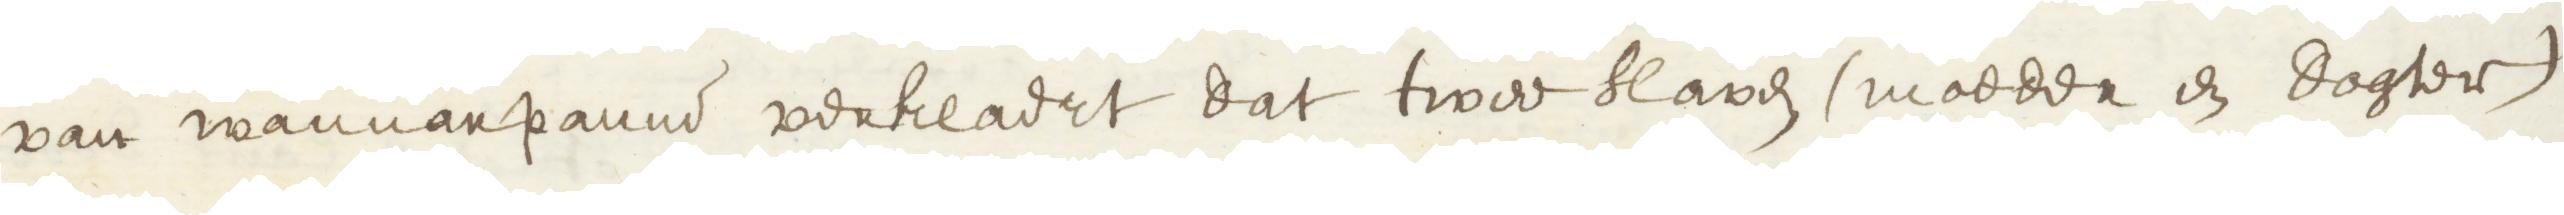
van wannarpanne verklaert dat twee slaven (moeder en dogter)
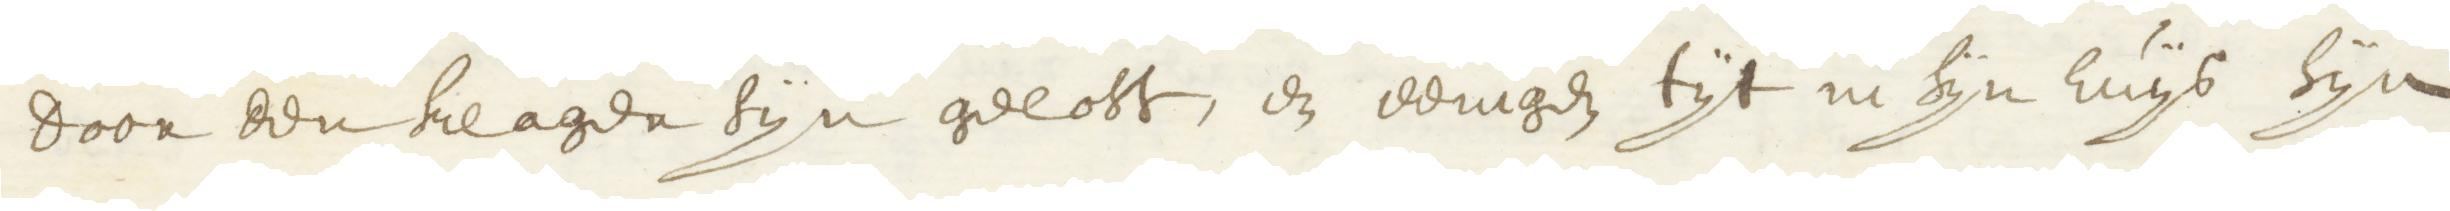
door den klager sijn gelost, en eenigen tijt in sijn huijs sijn
